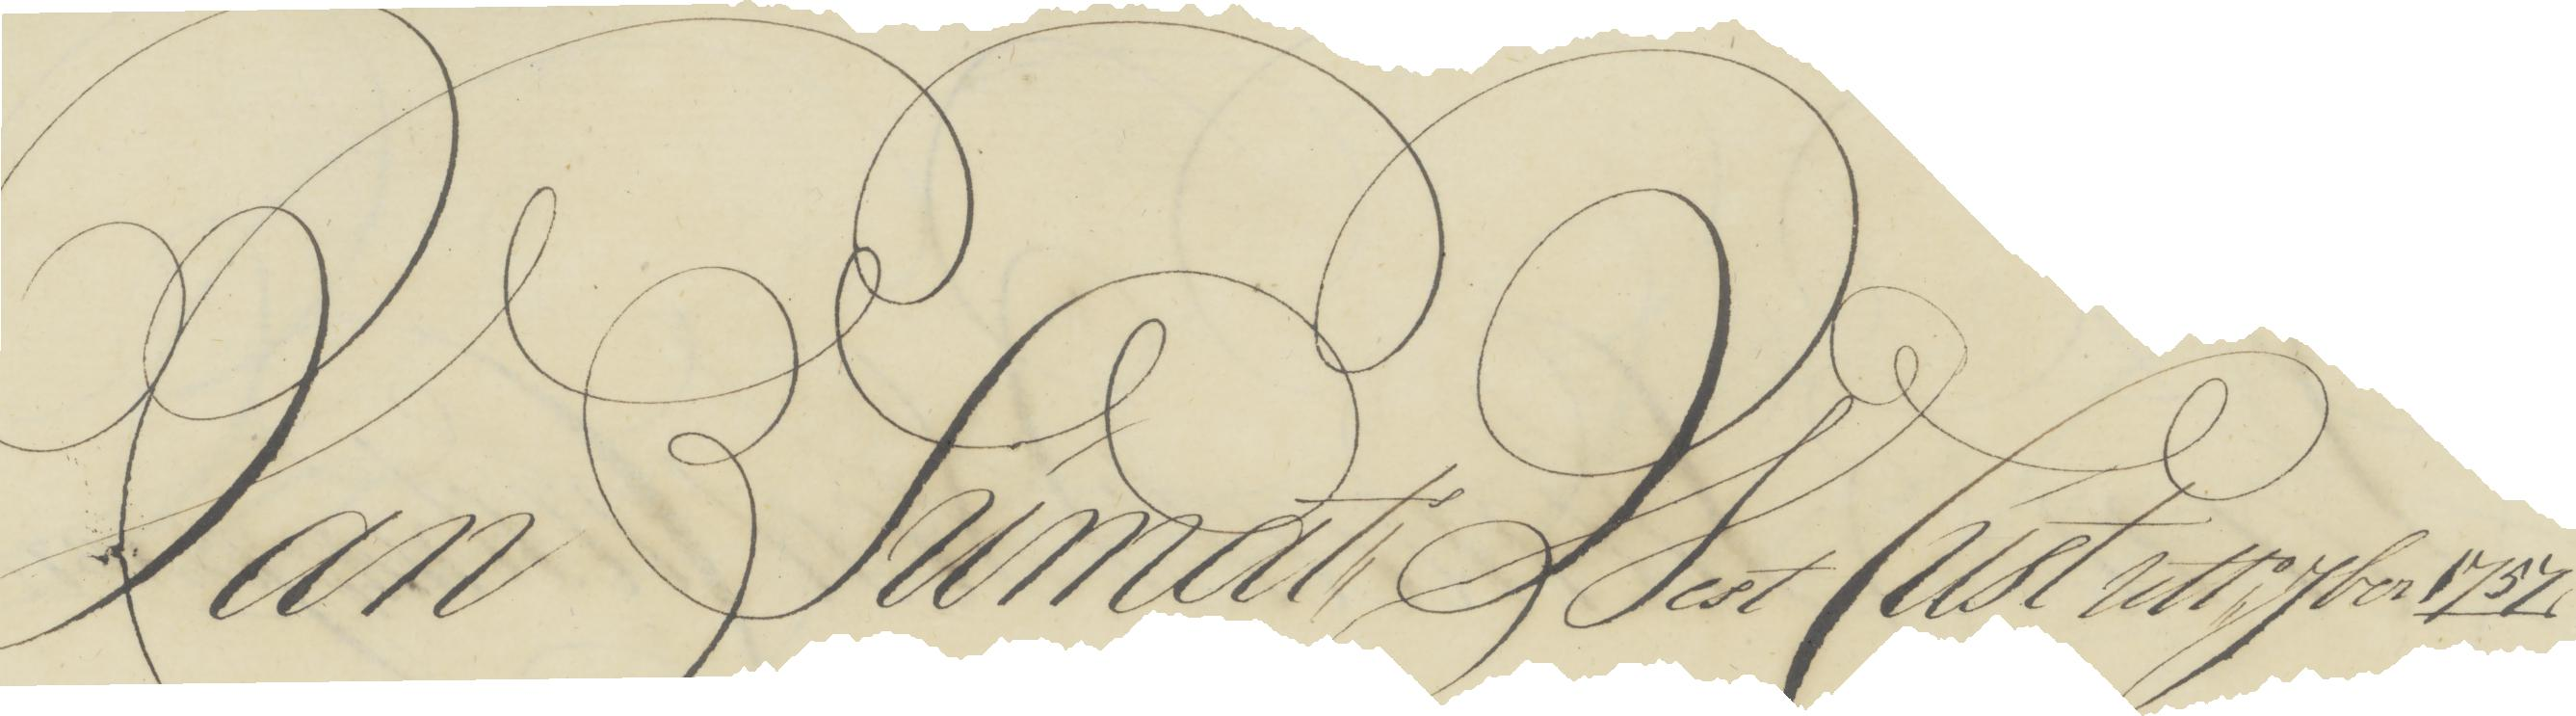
Van Sumas„s West Cust ult„o Jber 1757.
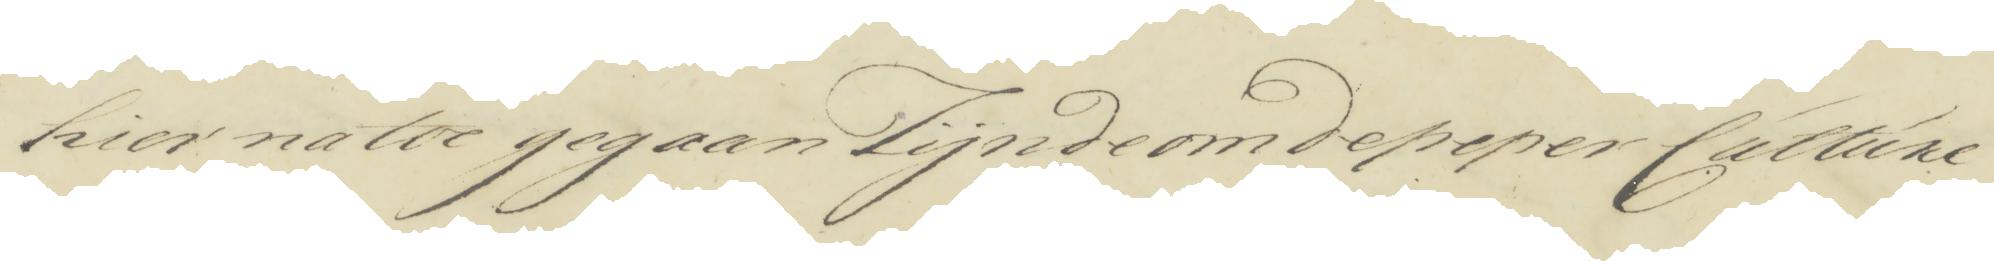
hier na toe gegaan zijnde om de peper Culture
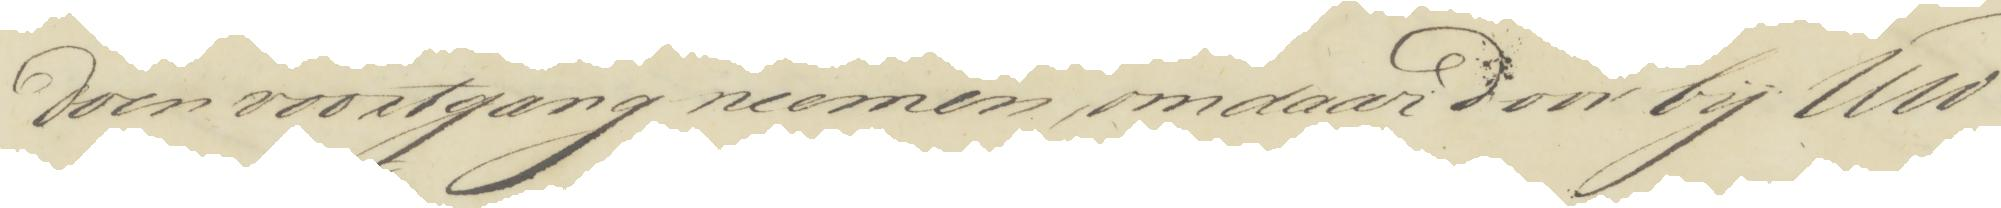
doen voortgang neemen, om daar door bij uw
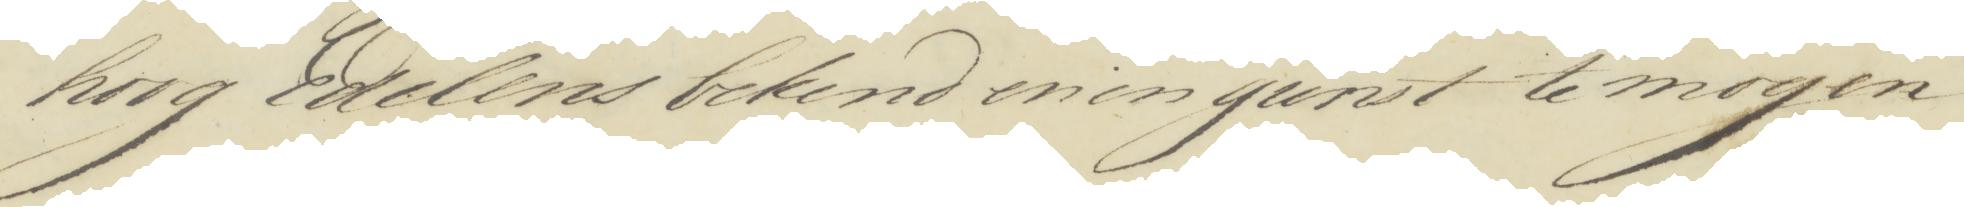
hoog Edelens bekend en in gunst te mogen
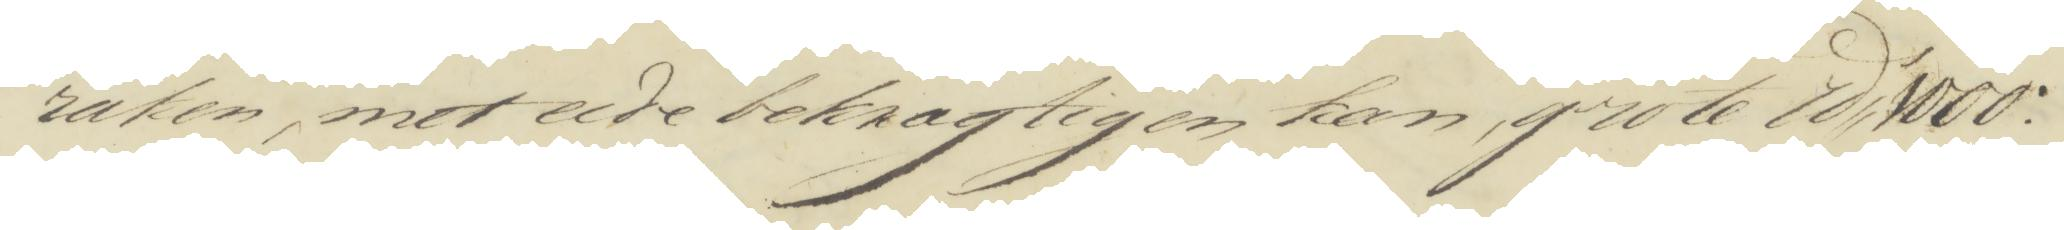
raken, met eede bekragtigen kan, grote rd„s 1000:
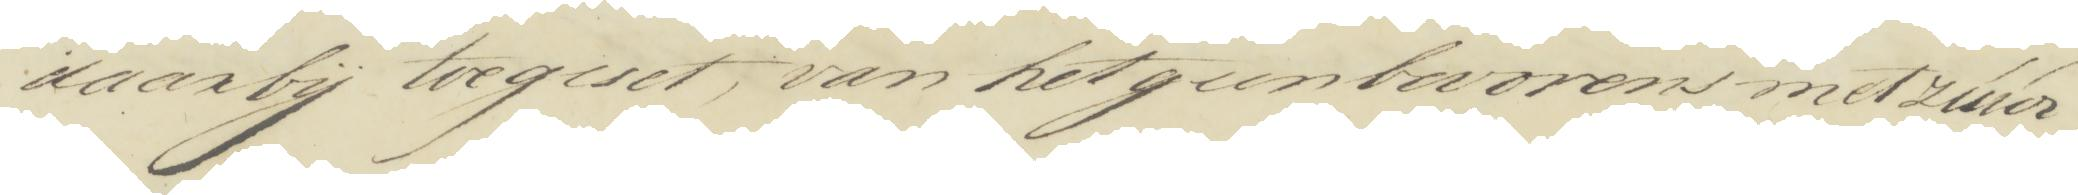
daarbij toegeset, van het geen bevorens met zuur
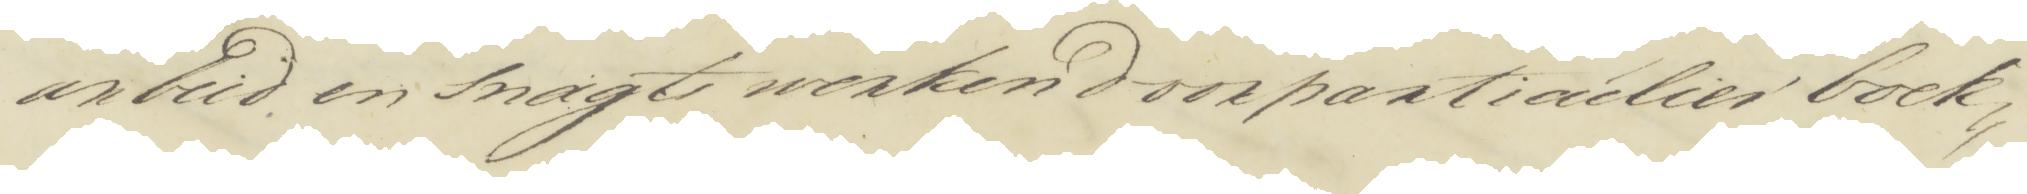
arbeid en snagts werken door particulier boek„
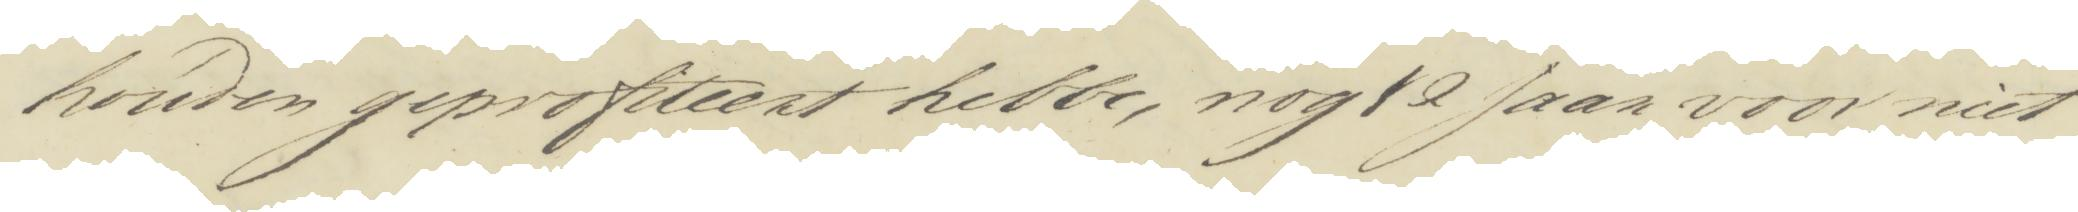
houden geprofiteert hebbe, nog 12 jaar voor niet
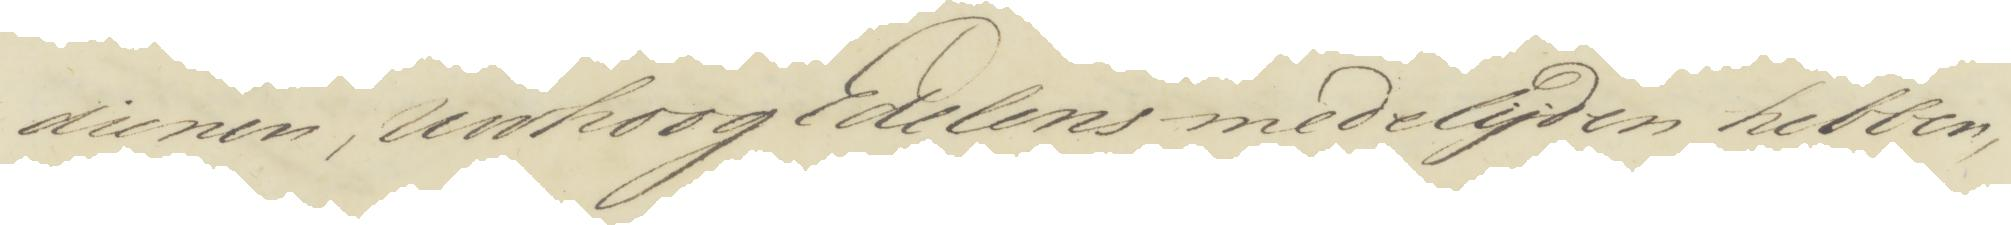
dienen, uw hoog Edelens medelijden hebben,
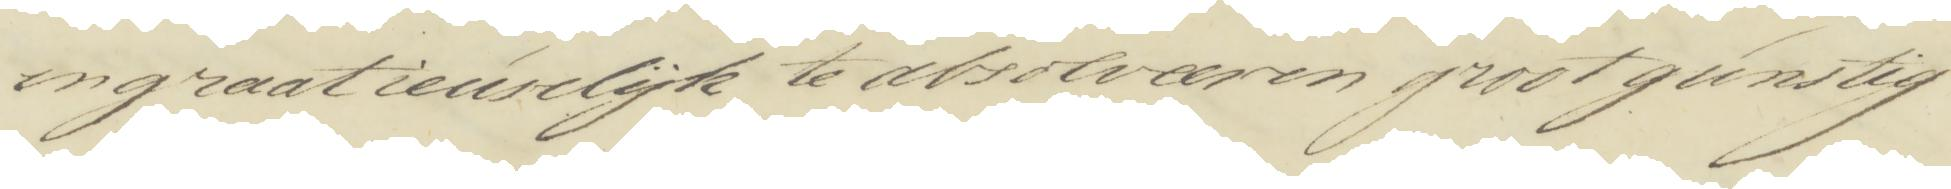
en graatieuselijk te absolveeren groot gunstig
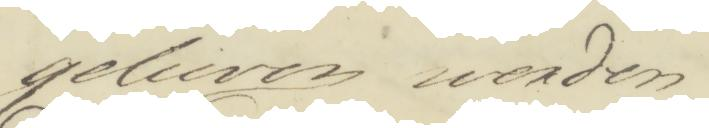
gelieven werden
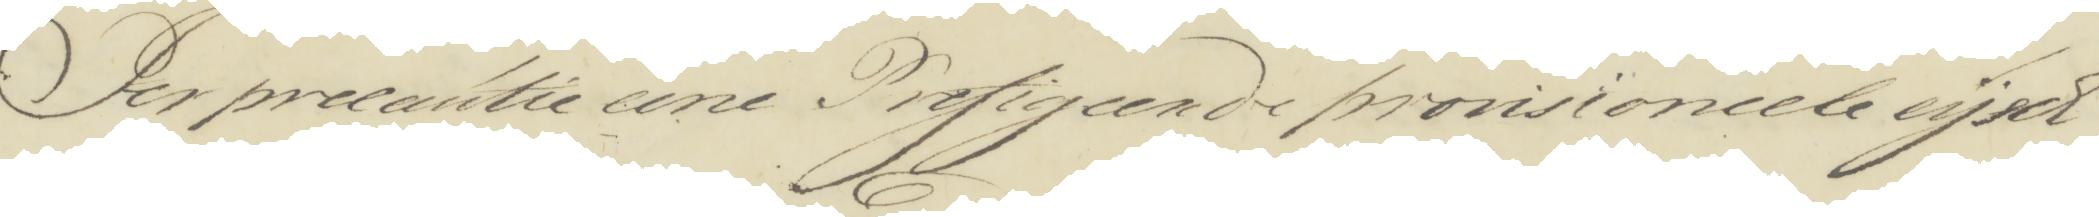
Per precautie eene Presigeerde provisioneele eijsch
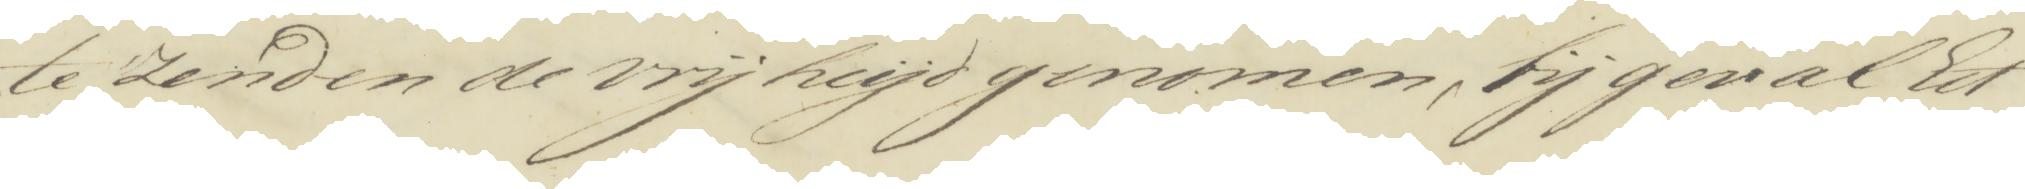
te zenden de vrijheijd genomen, bij geval het
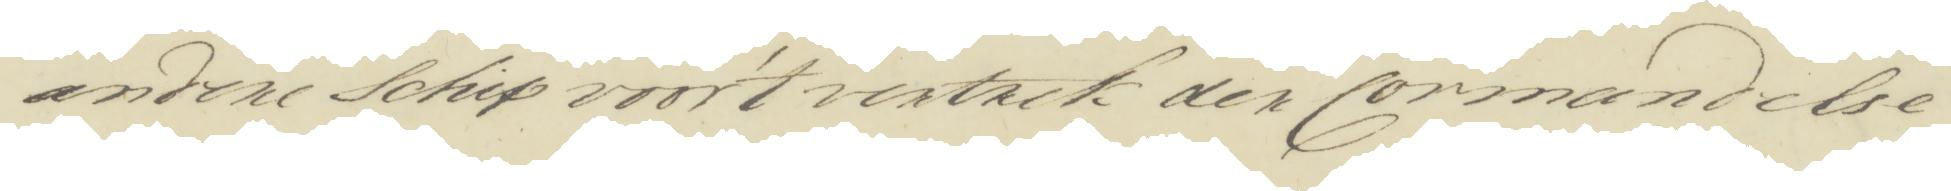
andere schip voor't vertrek der Cormandelse
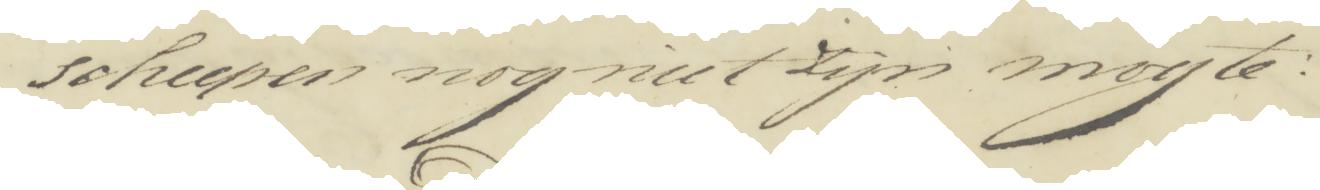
scheepen nog niet zijn mogte:
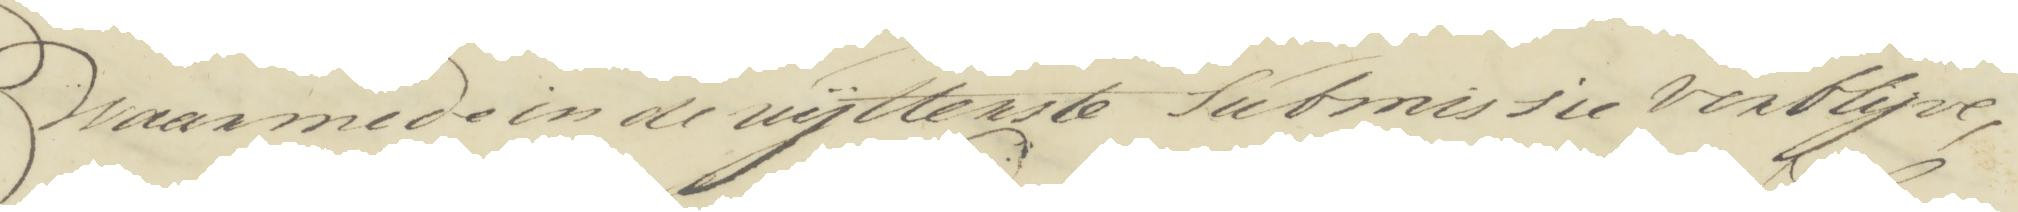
Waarmede in de uijtterste submissie verblijve,
